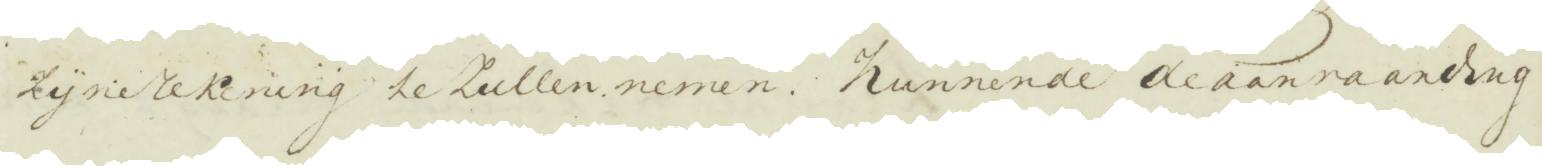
zijne rekening te zullen nemen. Kunnende de aanvaarding
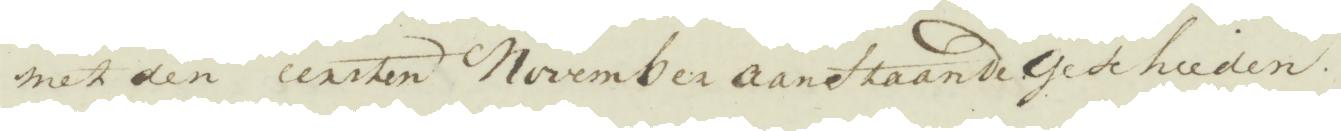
met den eersten November aanstaande geschieden.
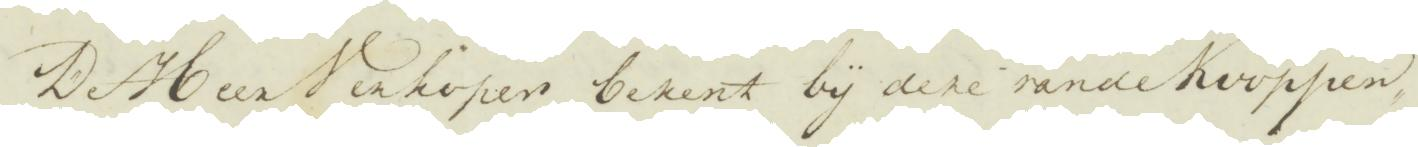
De Heer Verkoper bekent bij deze vande Kooppen„
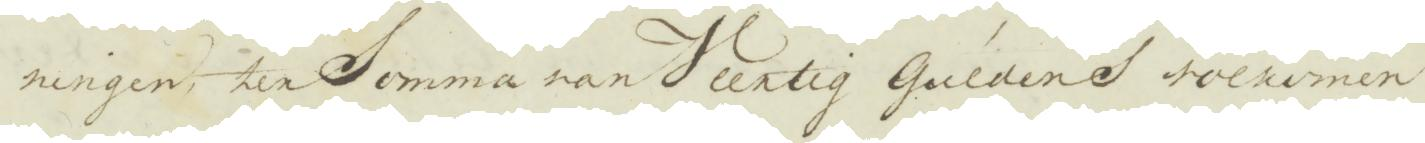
ningen, ten Somma van Veertig guldens volkomen
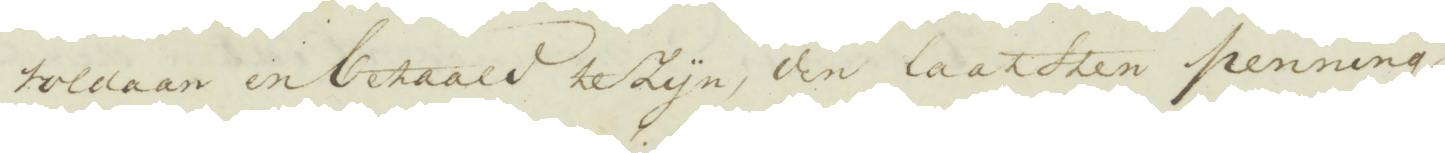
voldaan en betaald te zijn, den laatsten penning
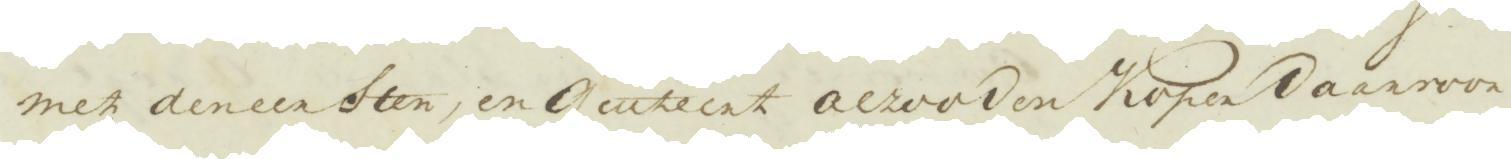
met deneersten, en quiteert alzooden Koper daarvoor
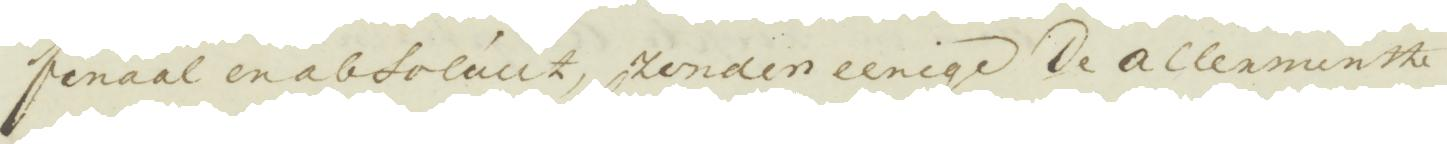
finaal en absoluut, zonder eenige de allerminste
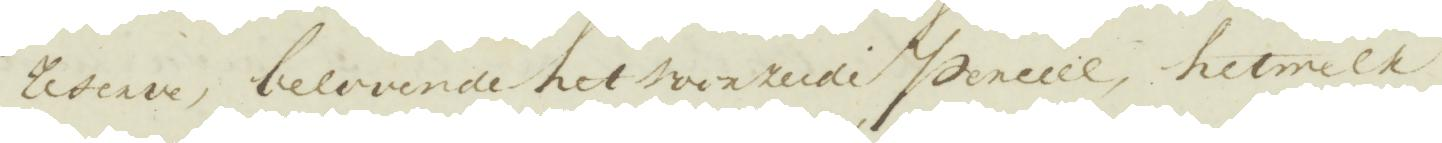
reserve, belovende het voorzeide Perceel, hetwelk
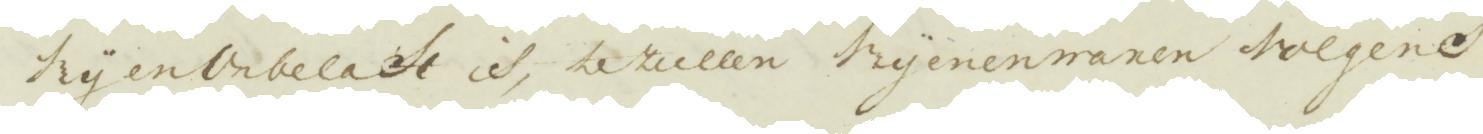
vrij en onbelast is, te zullen vrijenenwaren volgens
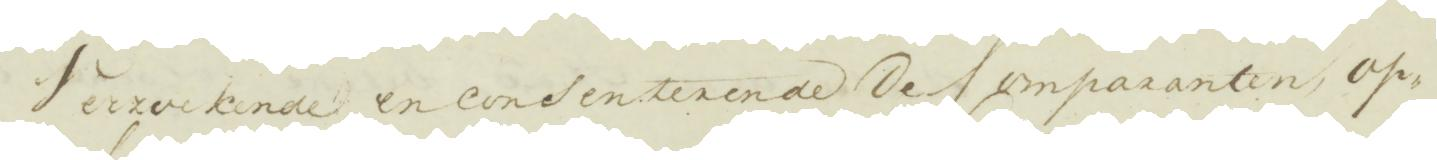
Verzoekende en consenterende de Comparanten, op„
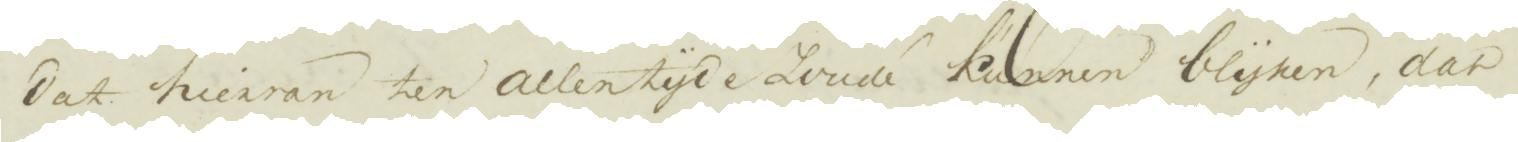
dat hiervan ten allentijde zoude kunnen blijken, dat
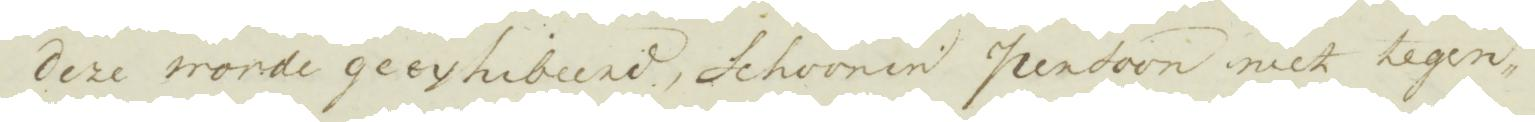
deze worde geexhibeerd, schoonin persoon niet tegen„
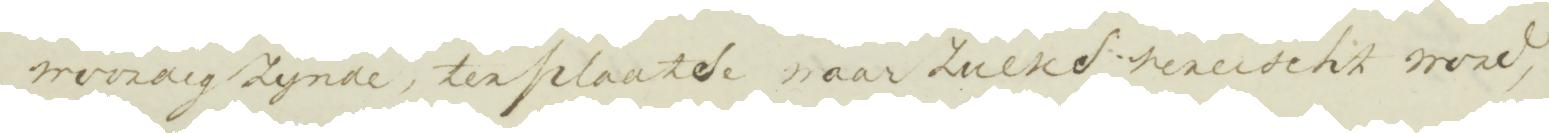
woordig zijnde, ter plaatse waar zulks vereischt word,
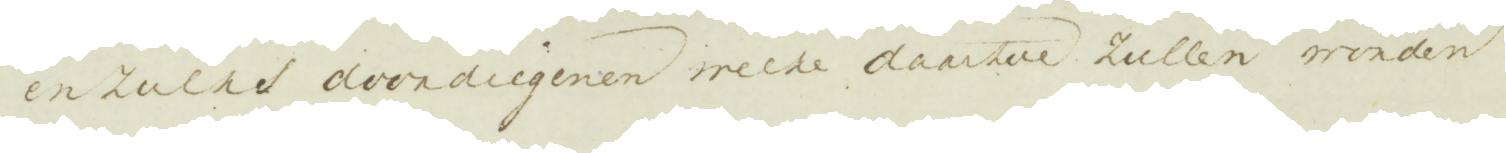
en zulks door diegenen meede daartoe zullen worden
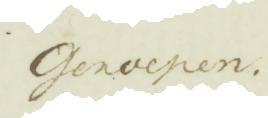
geroepen.
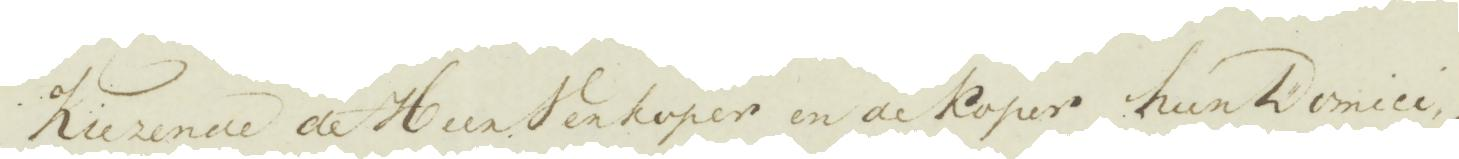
Kiezende de Heer Verkoper en de Koper hun Domici„
